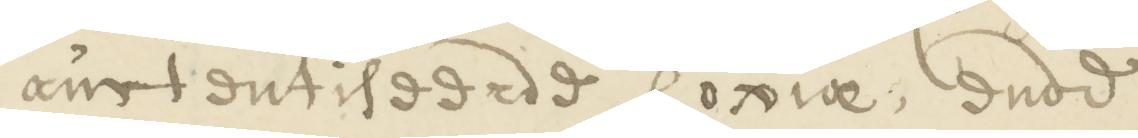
auctentiseerde Copia, ende
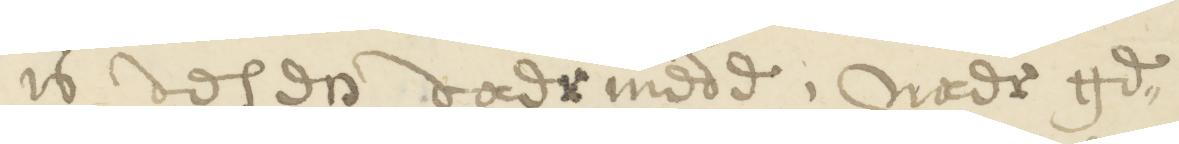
is desen daer mede: naer ge„
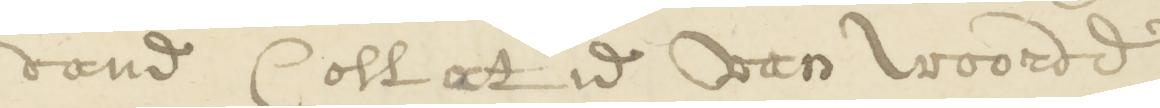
dane Collatie van woorde
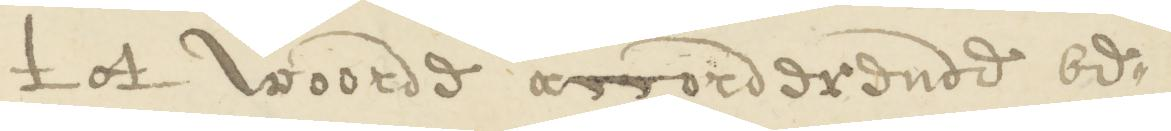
tot woorde accorderende be„
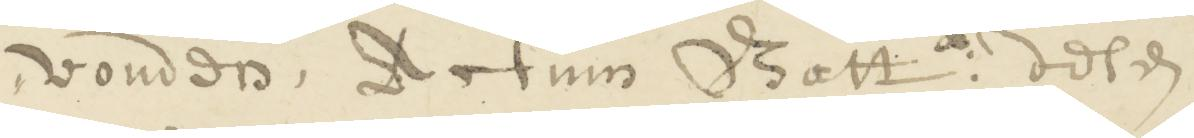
„vonden, Actum Batt:a desen
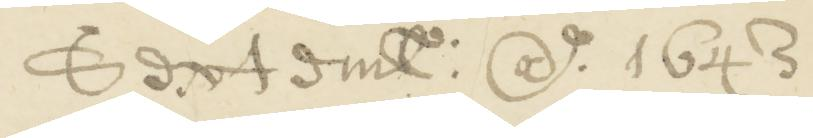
25=en septemb: @:o 1643
